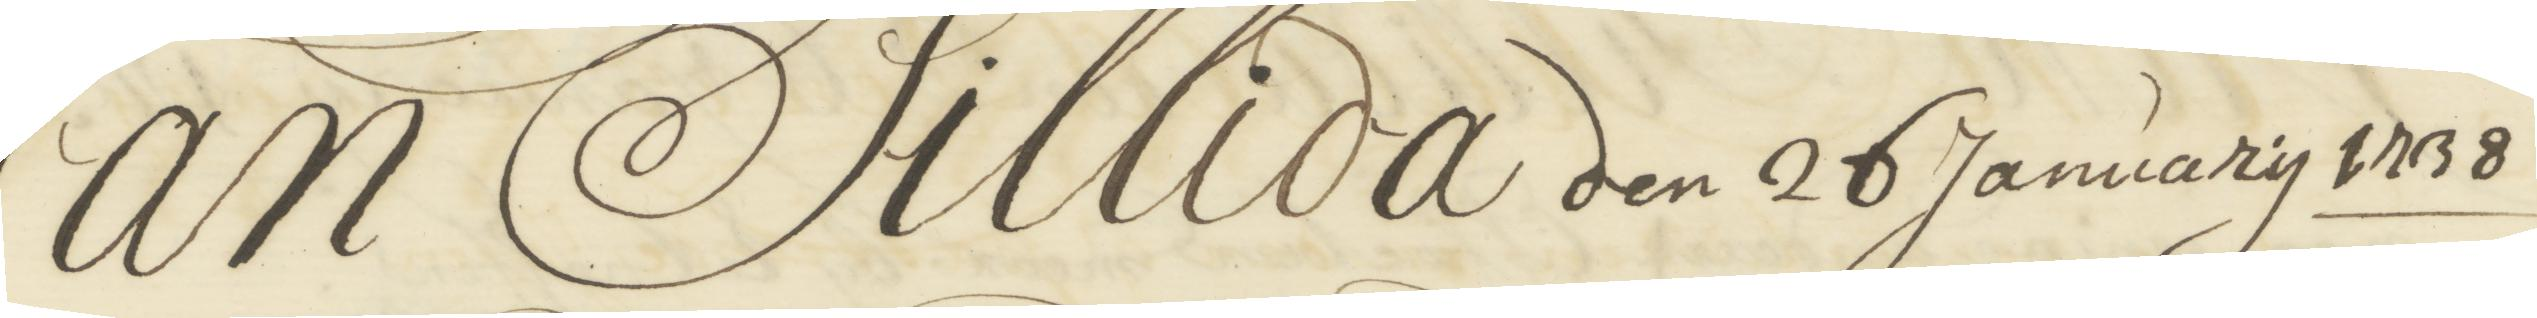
Van Sillida den 26 Januarij 1738
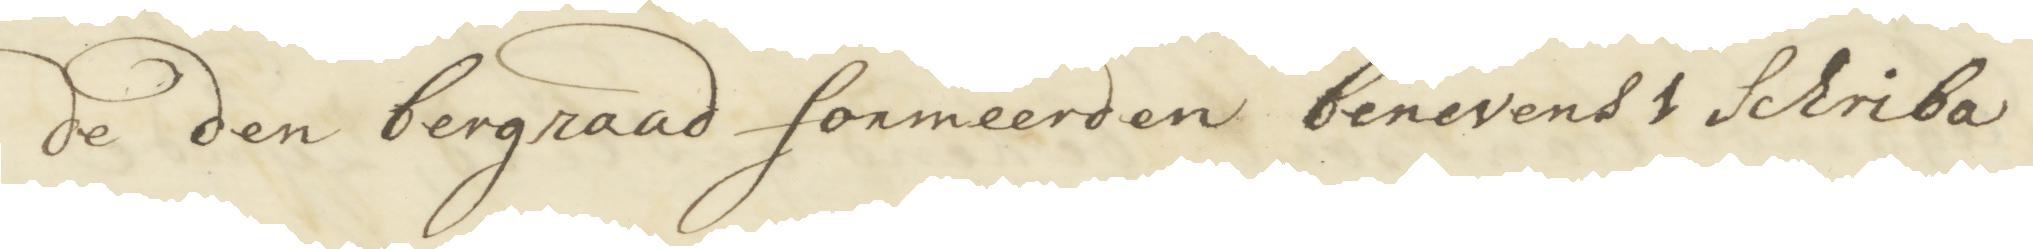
de den bergraad formeerden benevens 1 schriba
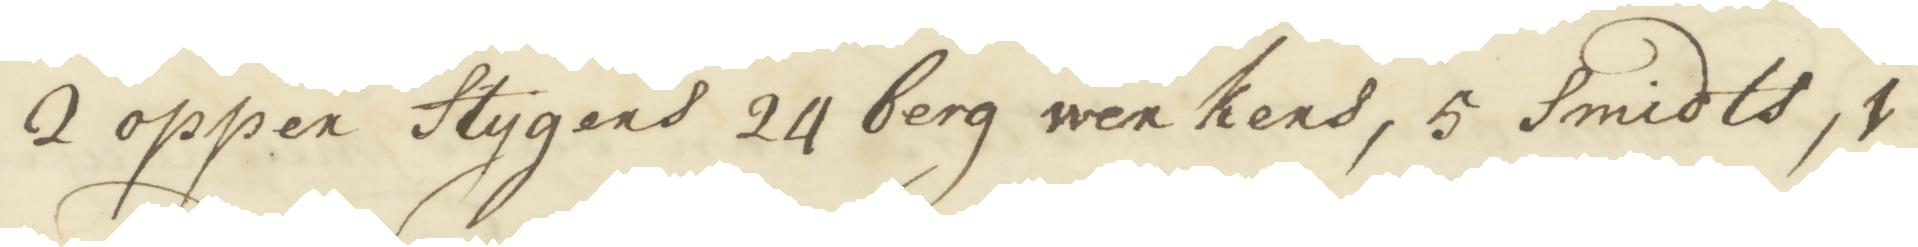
2 opper stijgers 24 berg werkers, 5 smidts, 1
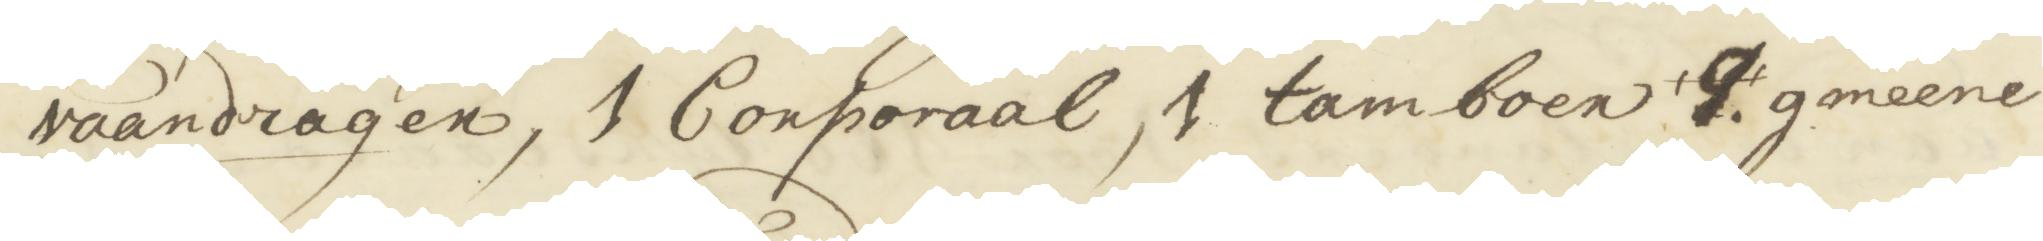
vaandrager, 1 Corporaal, 1 tamboer 9. gmeene
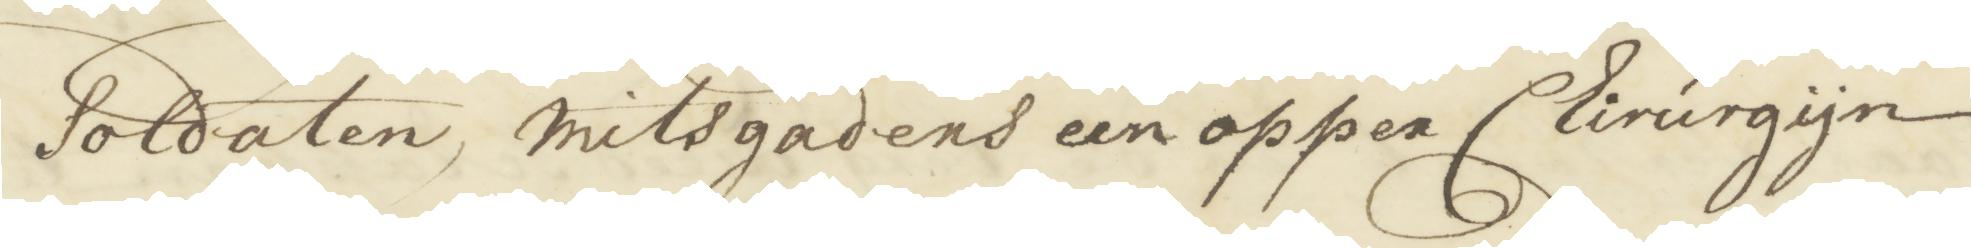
soldaten, mitsgaders een opper Chirurgijn
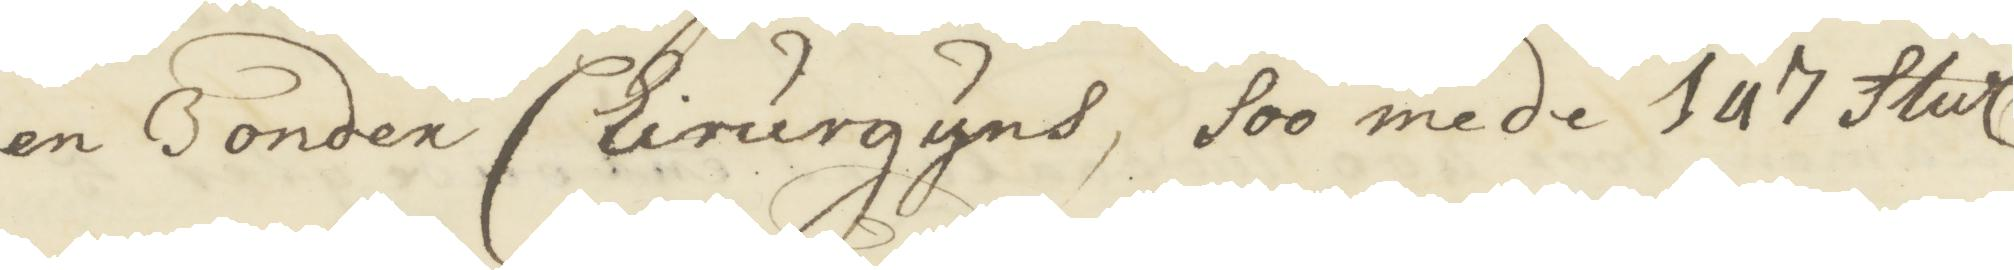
en 3 onder Chirurgijns, soo mede 147 stur
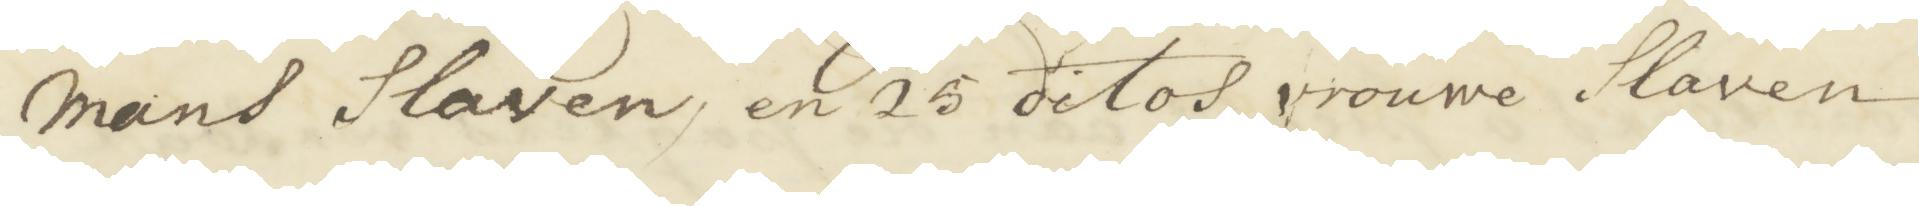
mans slaven, en 25 ditos vrouwe slaven
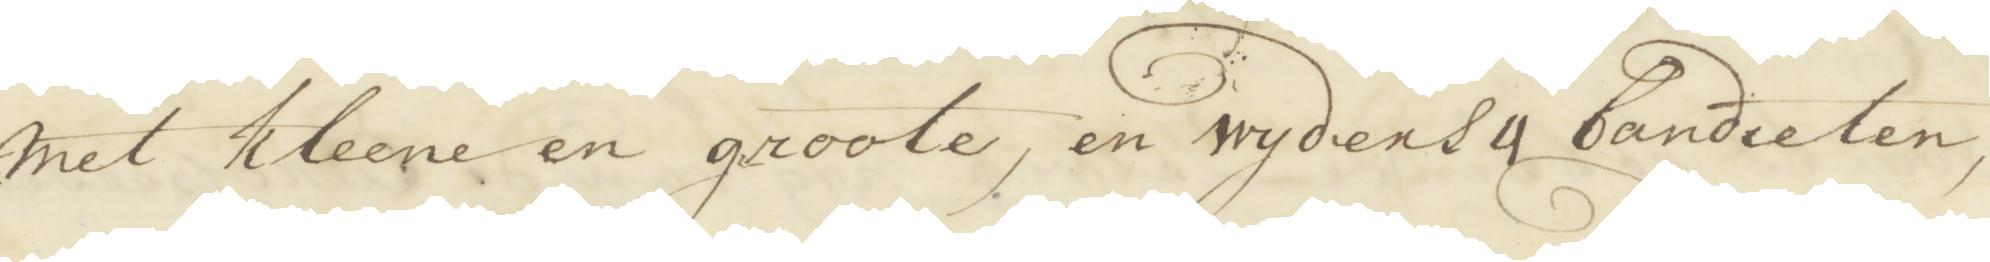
met kleene en groote, en wyders 4 bandieten,
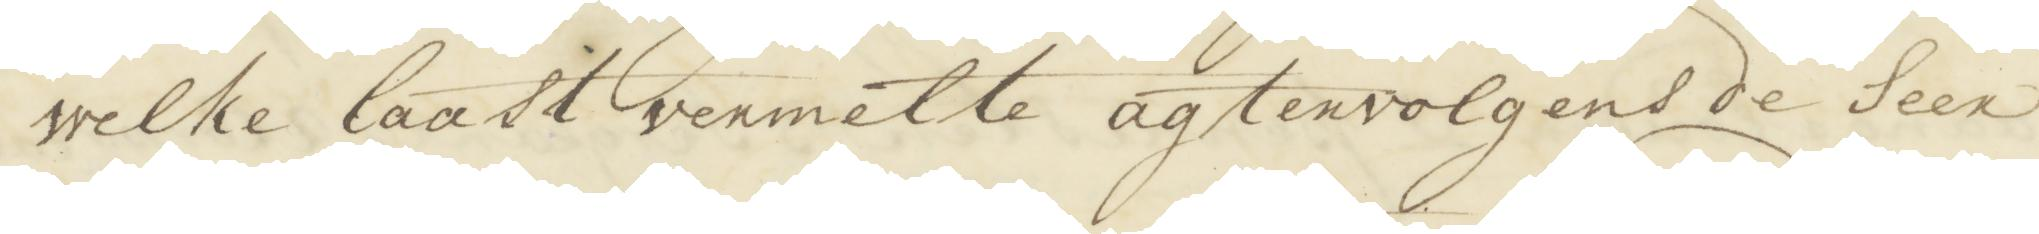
welke laast vermelte agtervolgens de seer
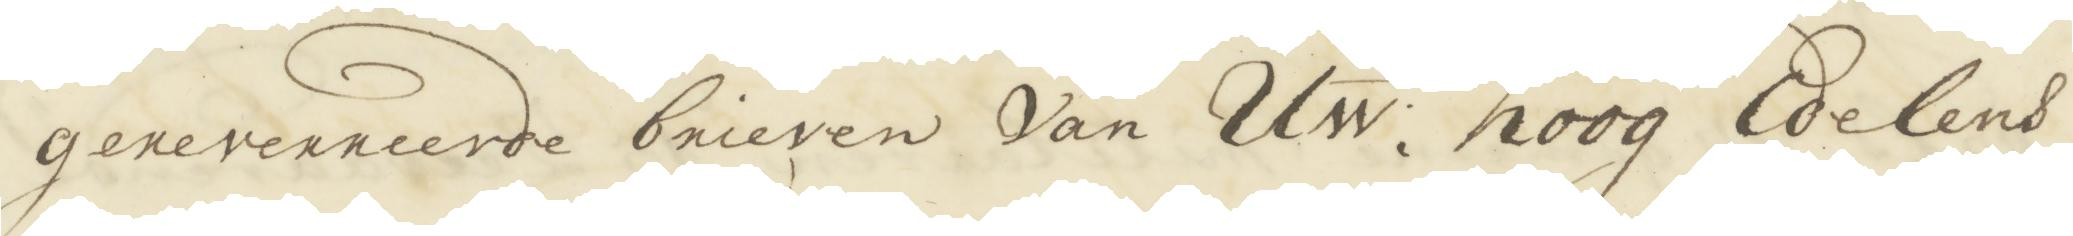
gereverreerde brieven van Uw: hoog Edelens
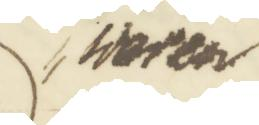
„waren
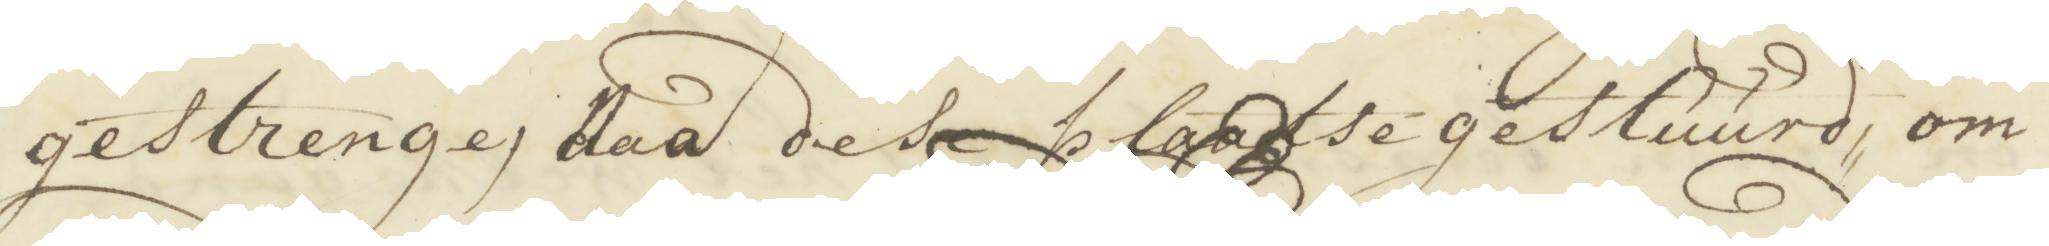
gestrenge, Naa des plaatse gestuurd„ om
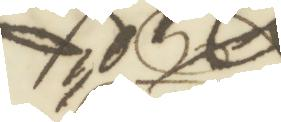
dEE
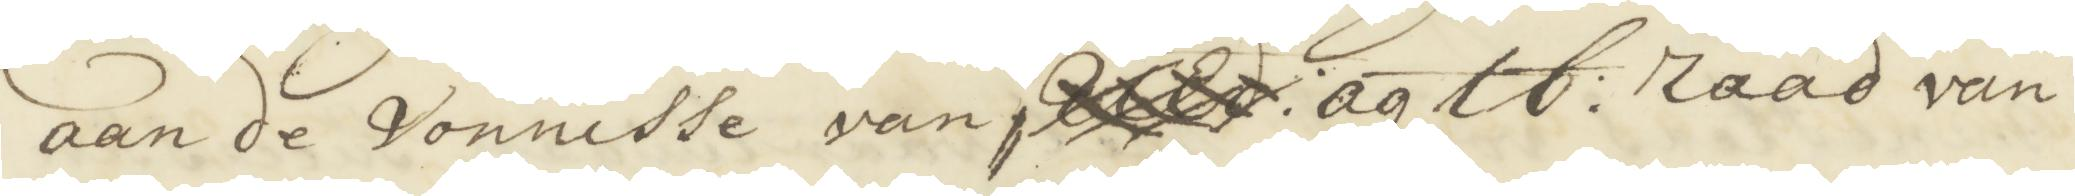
aan de vonnisse van „ uEd. agtb: raad van
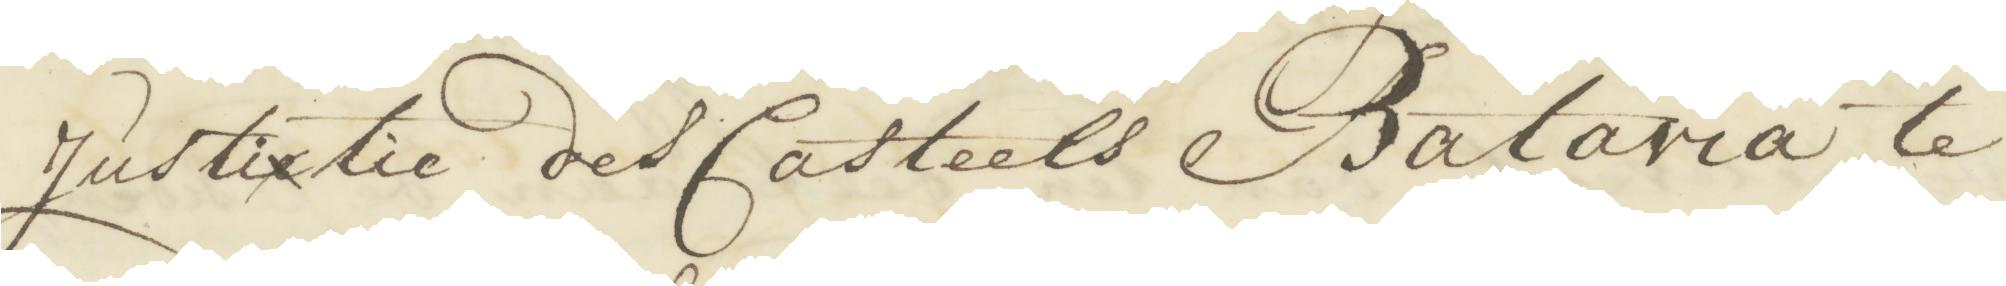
Justietie des Casteels Batavia te
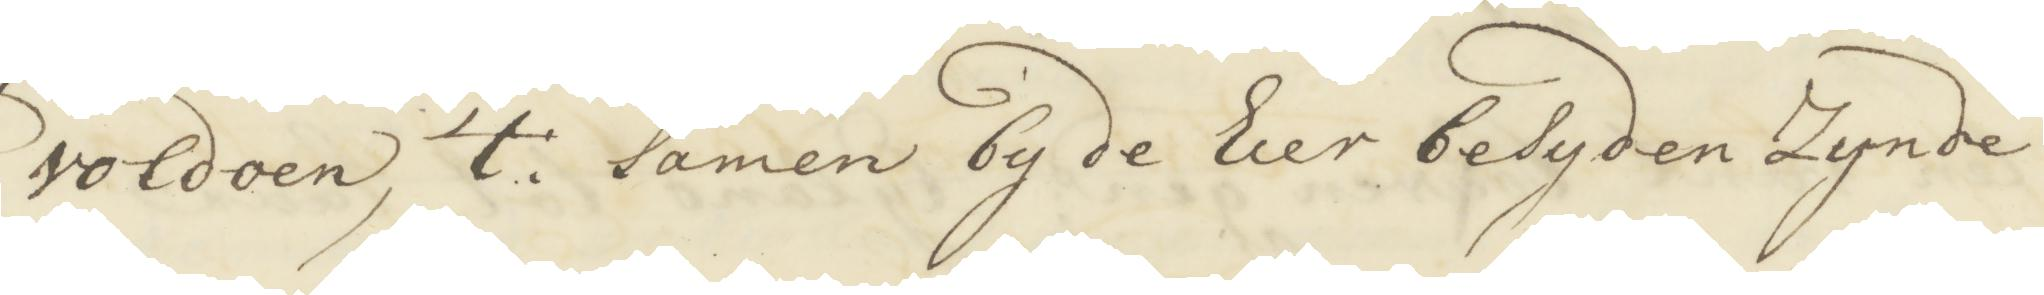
voldoen, 't: samen by de hier besyden zynde
